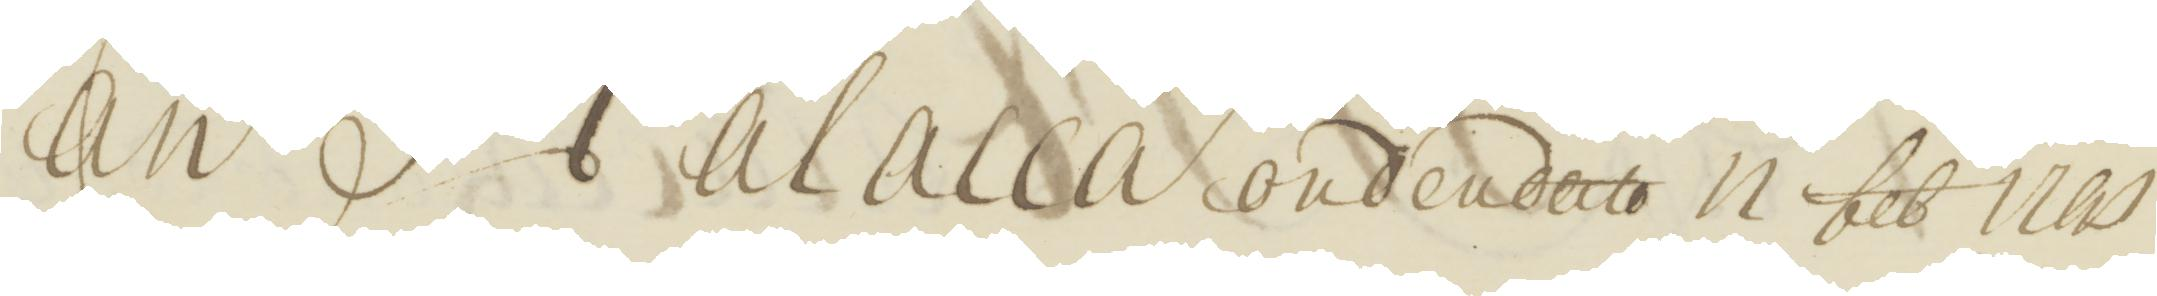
Van Malacca onder dato 11 feb 1741
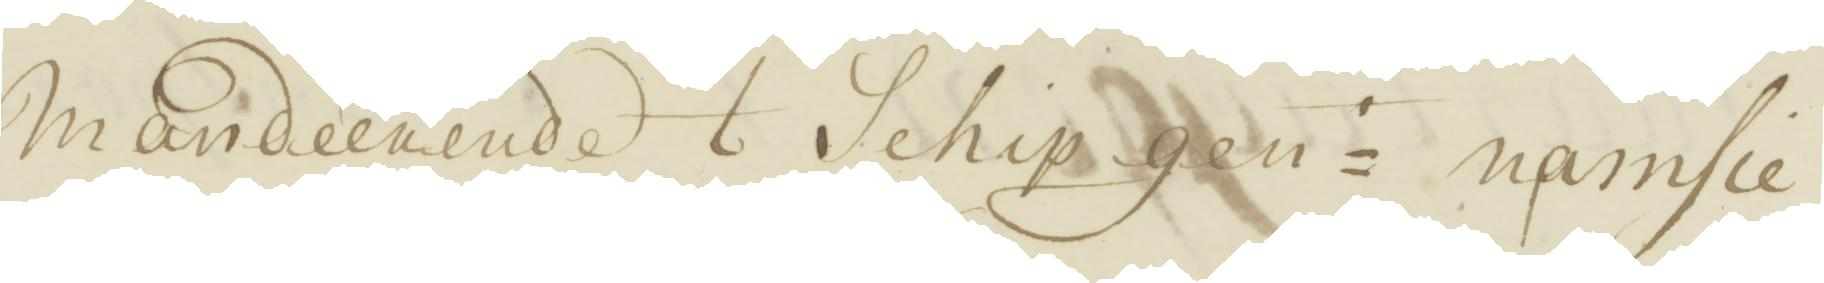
mandeerende 't Schip gen=t namsie
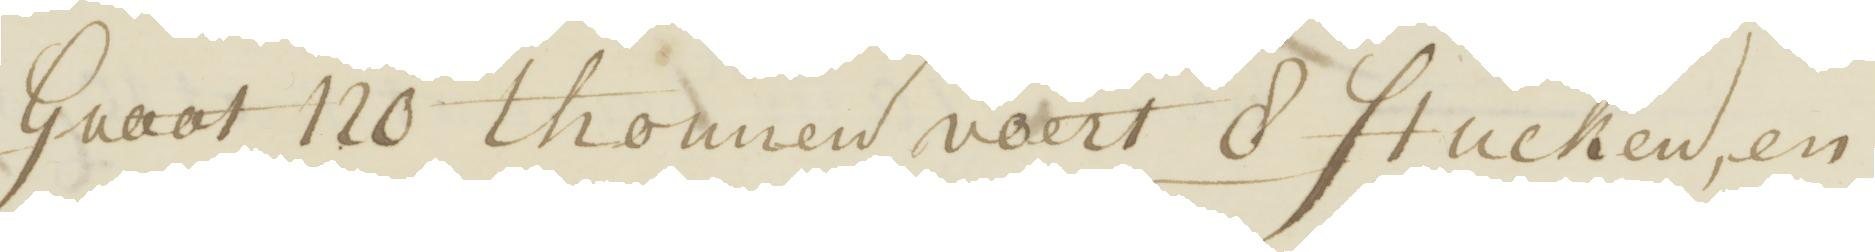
Groot 120 thonnen voert 8 stucken, en
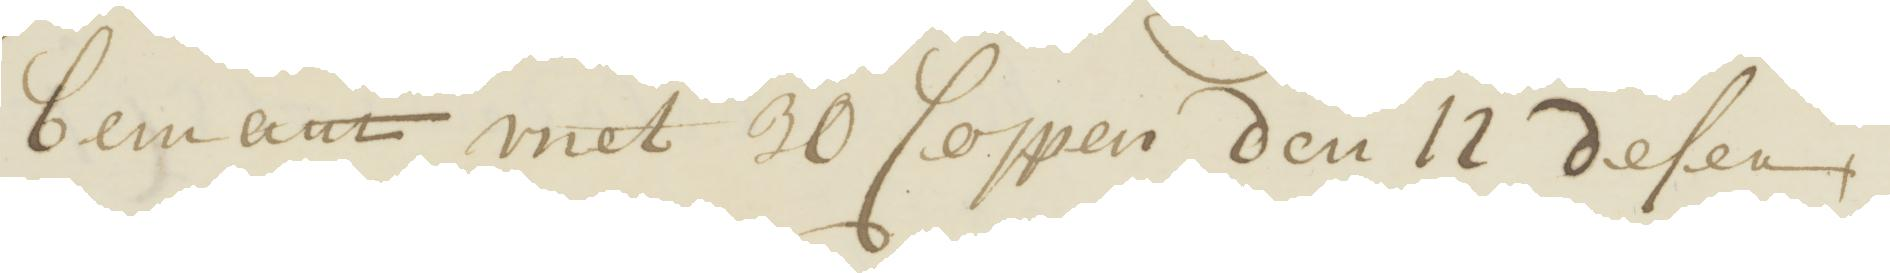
bemant met 30 Coppen den 12 deser,
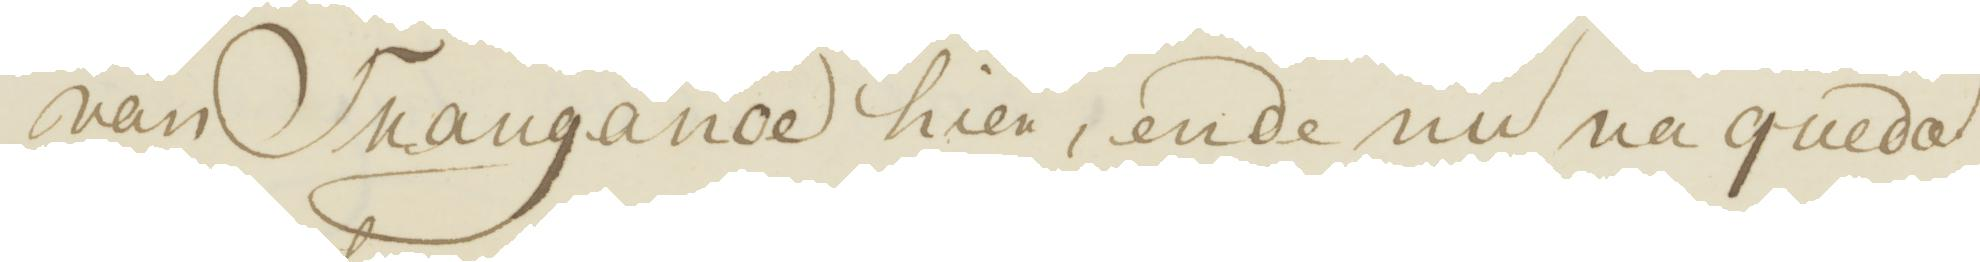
van Tranganoe hier, ende nu na queda
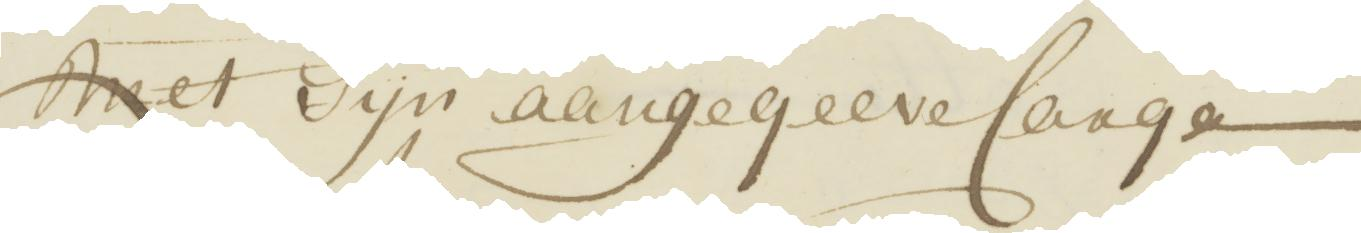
met sijn aangegeeve carga
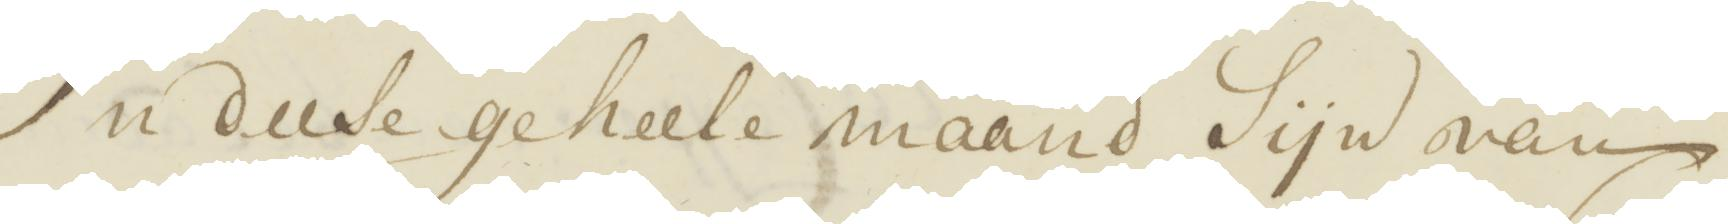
In deese geheele maand Sijn van
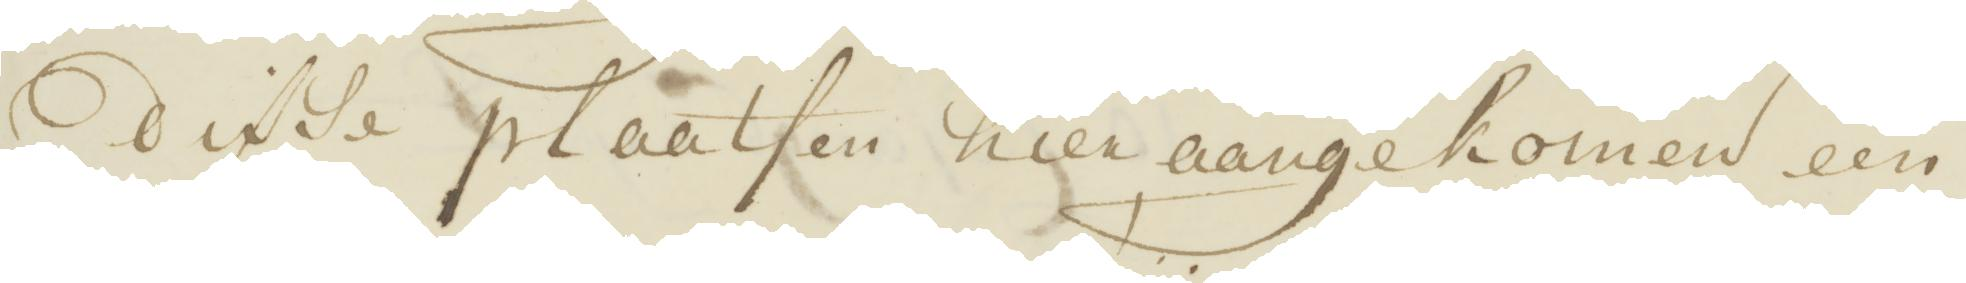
diverse plaatsen hier aangekomen een
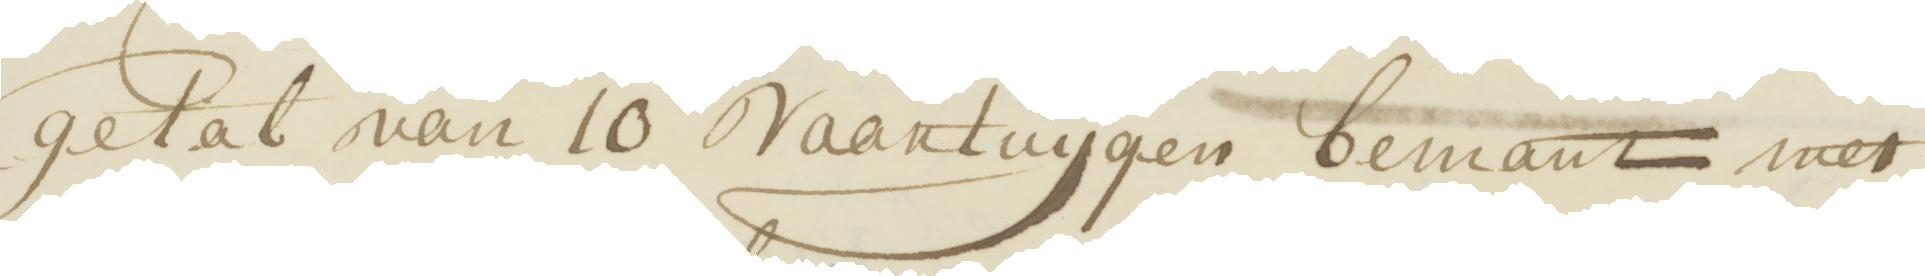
getal van 10 vaartuijgen bemant met
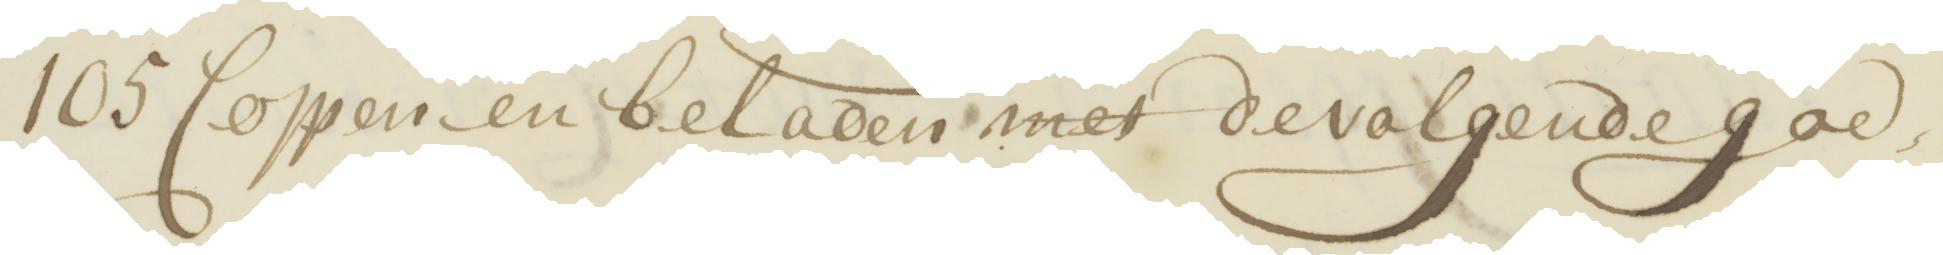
105 Coppen en beladen met de volgende goe„
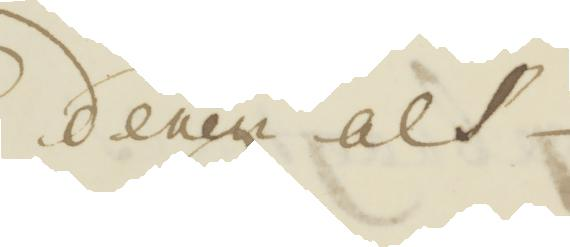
deren als
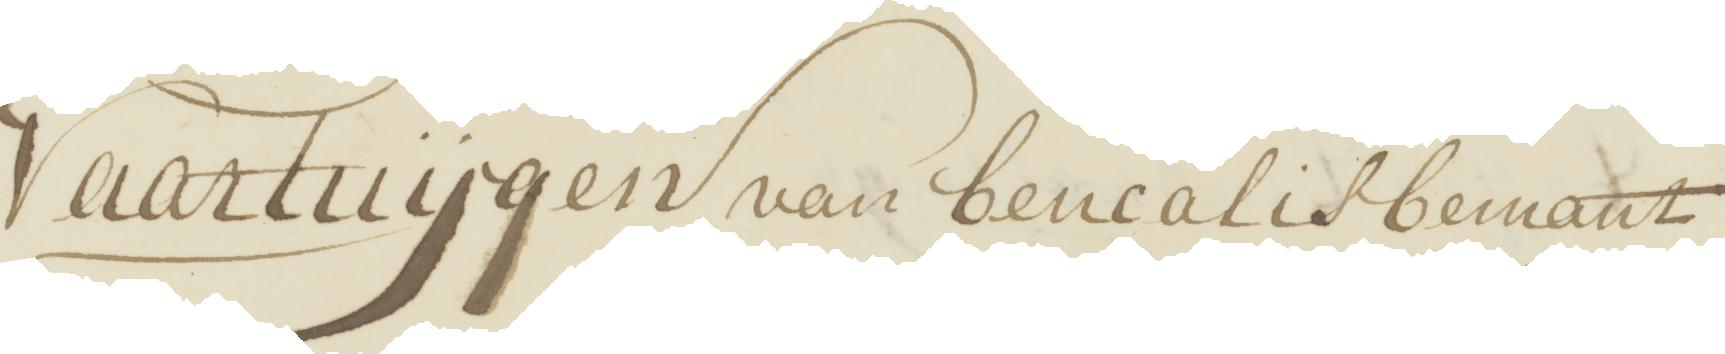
4 Vaartuijgen van bencalis bemant
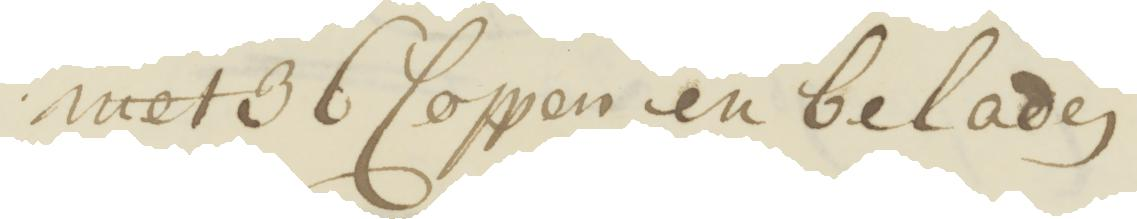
met 36 Coppen en beladen
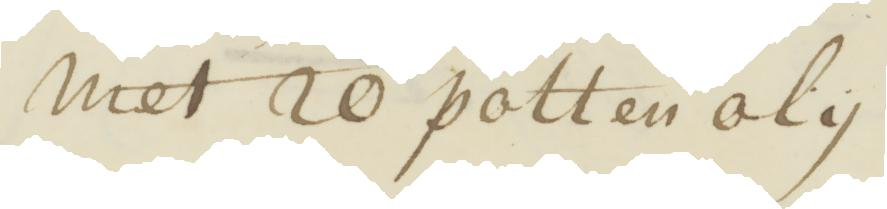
met 20 potten olij
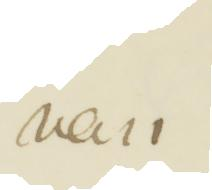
3 —:' van
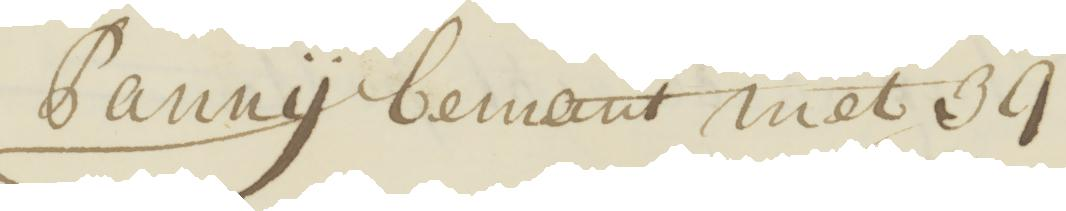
Pannij bemant met 39
